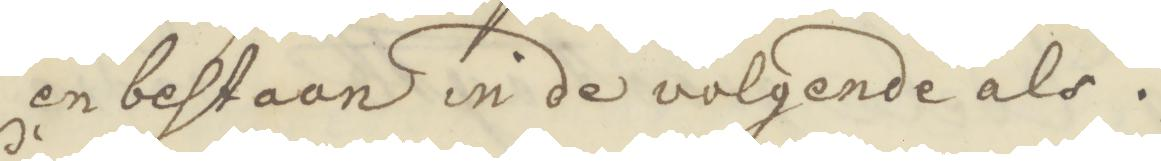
en bestaan in de volgende als.
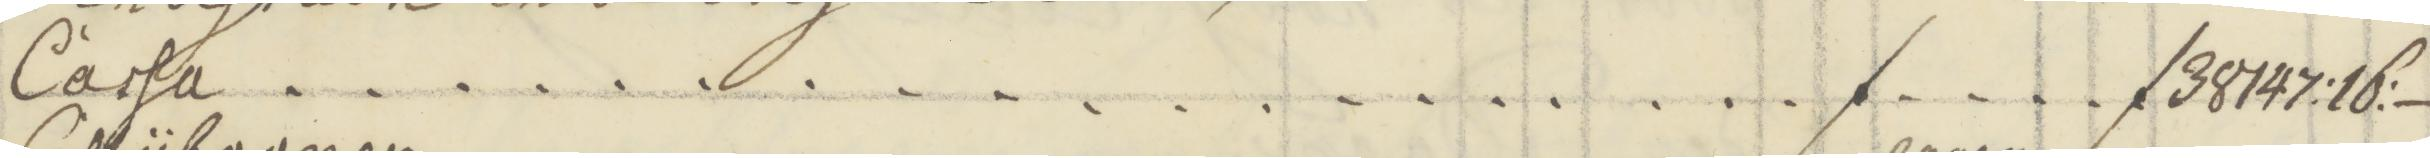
Cassa - - - - - - - - - - - - - - - - - - - ƒ - - - - ƒ 38747: 16: —
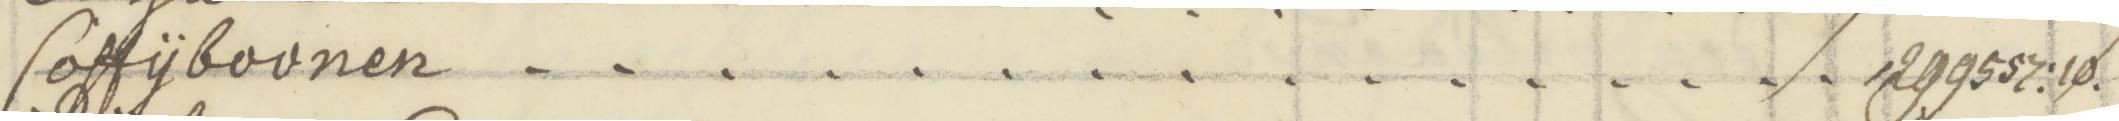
Coffijboonen - - - - - - - - - - - - - - - - „ 299557: 10.
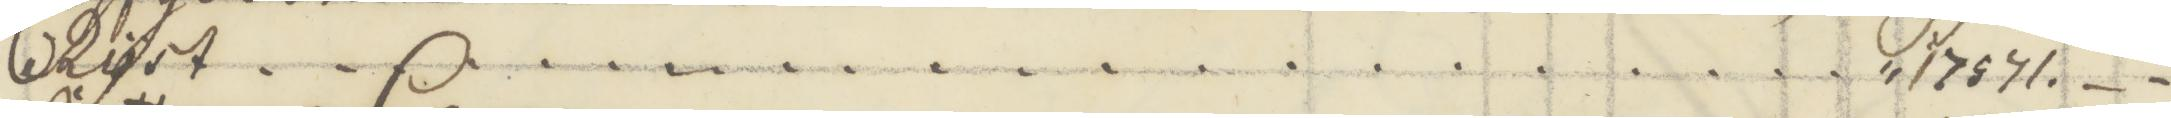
Rijst - - - - - - - - - - - - - - - - - - - - - - „ 17571. — —
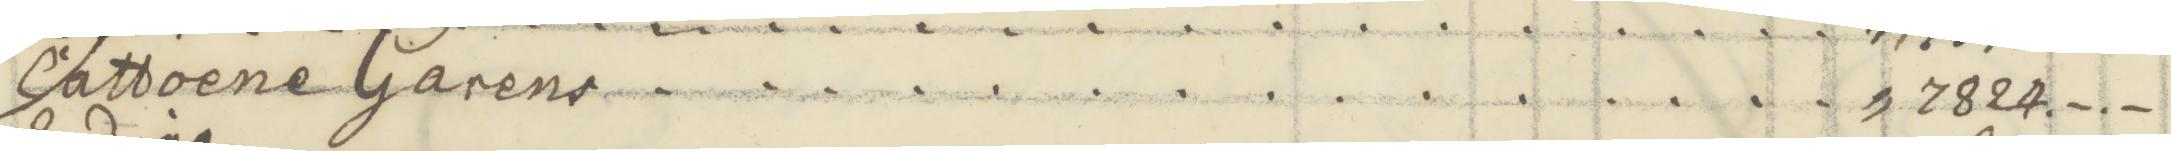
Cattoene Garens - - - - - - - - - - - - - - - „ 7824. —. —
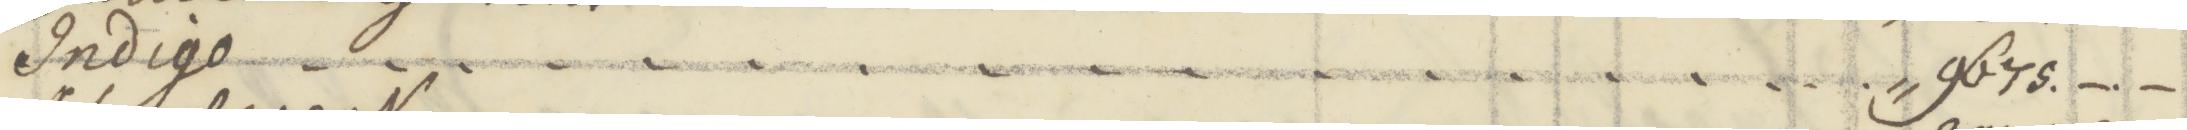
Indigo - - - - - - - - - - - - - - - - - - „ 9675. —. —
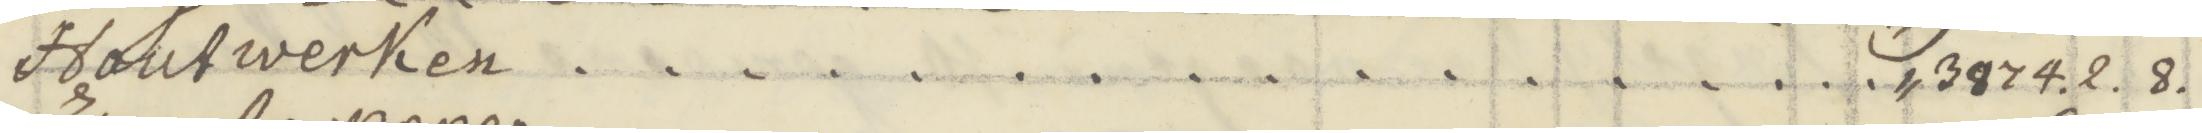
Houtwerken - - - - - - - - - - - - - - - - - „ 3874. 2. 8.
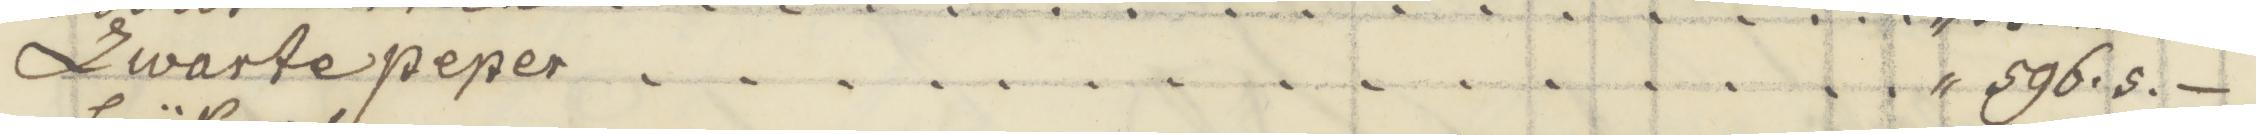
Zwarte peper - - - - - - - - - - - - - - - „ 596. 5. —
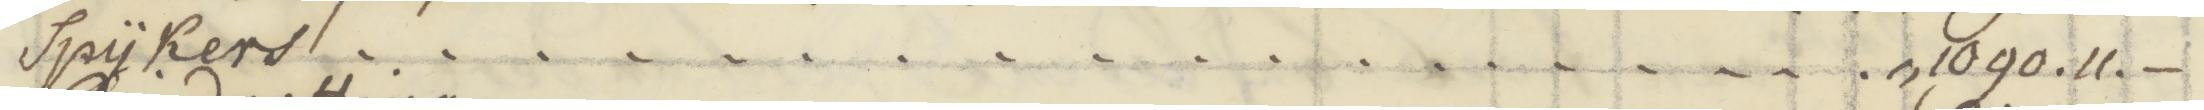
Spijkers - - - - - - - - - - - - - - - - - - -„ 1090. 11. —
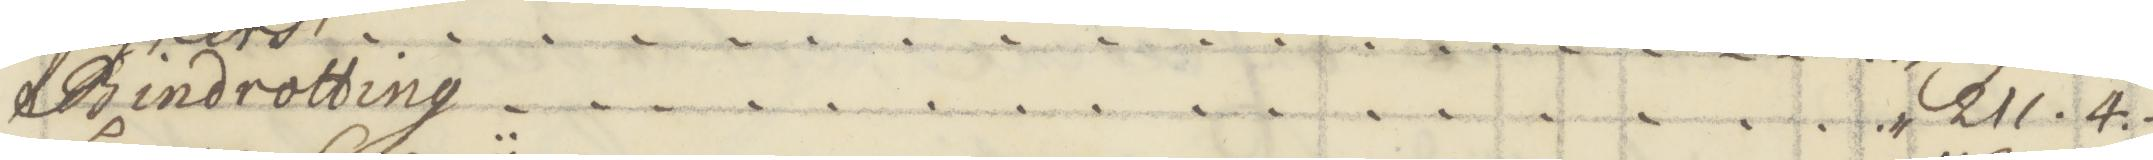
Bindrotting - - - - - - - - - - - - - - - - - „ 211. 4.
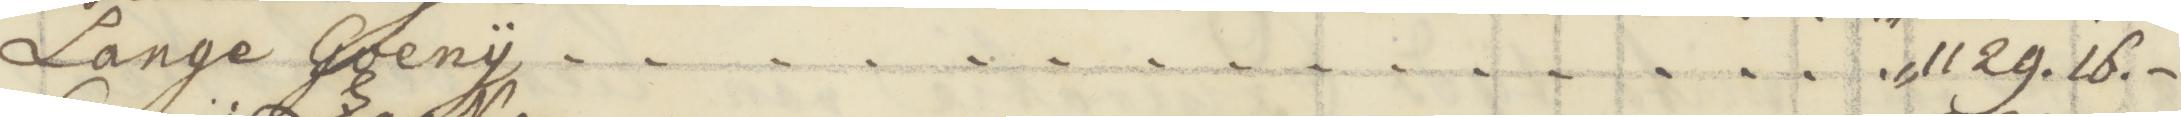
Lange Goenij - - - - - - - - - - - - - - - - „ 1129. 16. —
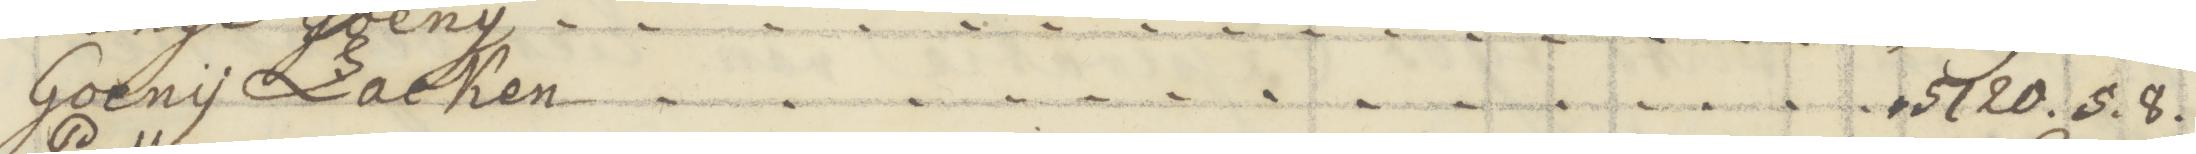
Goenij Zacken - - - - - - - - - - - - - - - „ 5720. 5. 8.
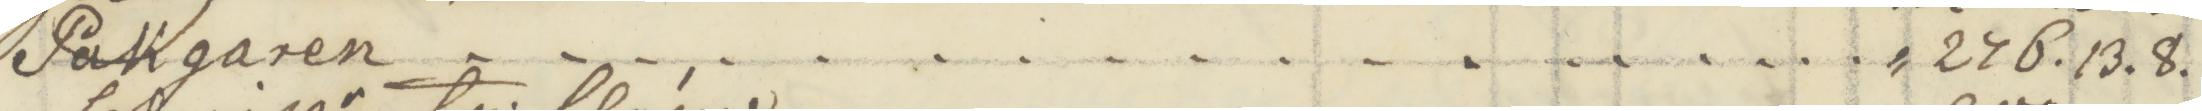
Pakgaren - - - - - - - - - - - - - - - - - - „ 276. 13. 8.
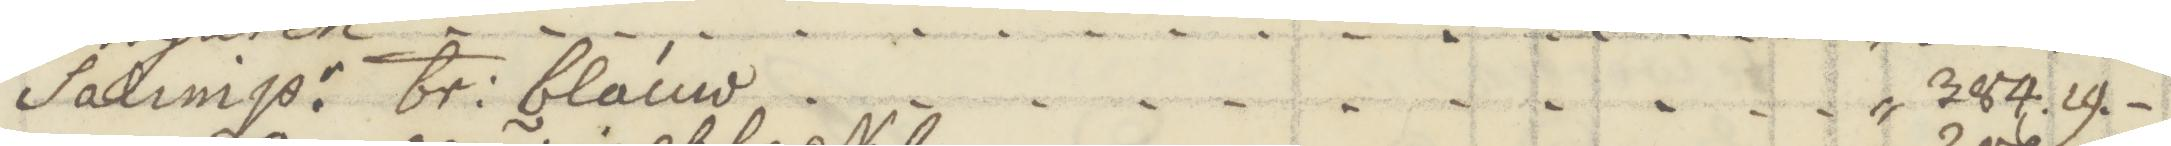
Salimp:s br: blauw - - - - - - - - - - - „ 384. 19. —
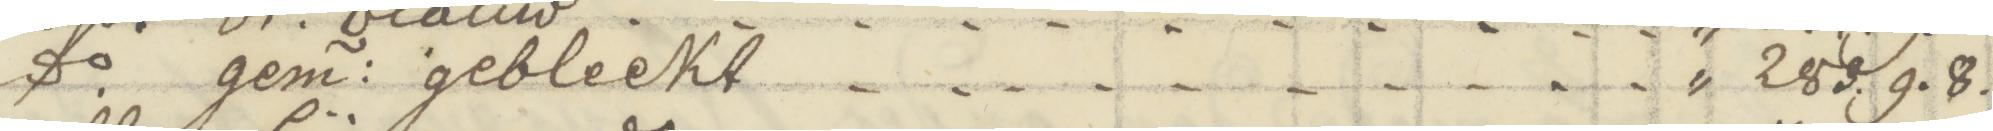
d„o gem: gebleekt - - - - - - - - - - „ 285. 9. 8
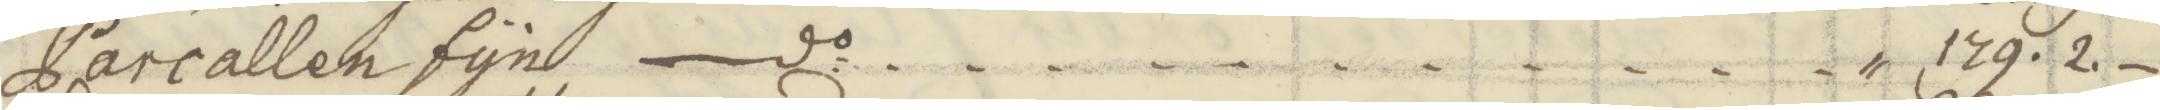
Parcallen fijn d=o - - - - - - - - - - - „ 179. 2.
